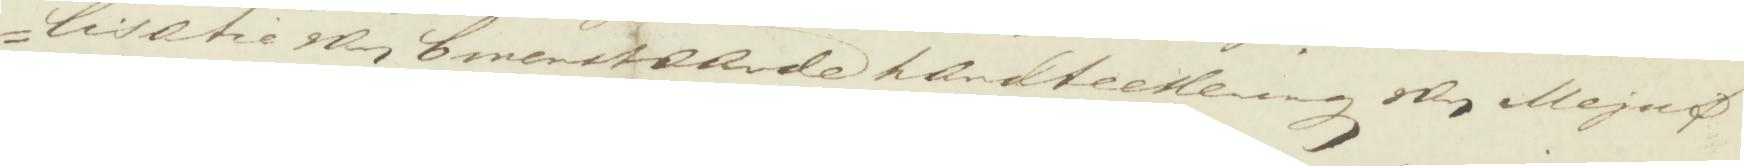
=lisatie van bovenstaande handteekening van Mejuf
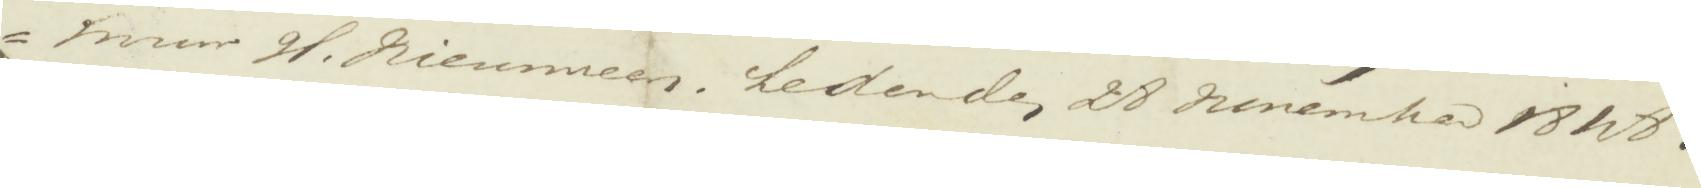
=vrouw H. Nieuwveen, heden den 28 november 1848.
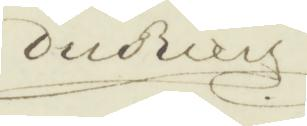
du Riers
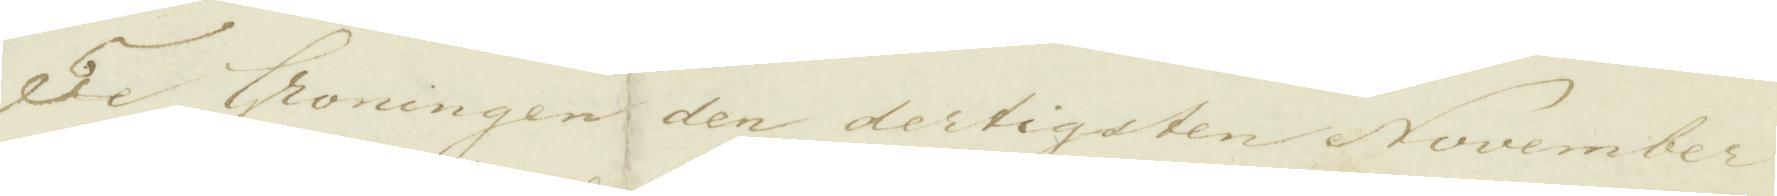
Te Groningen den dertigsten November
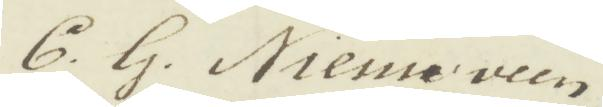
C. G. Nieuwveen
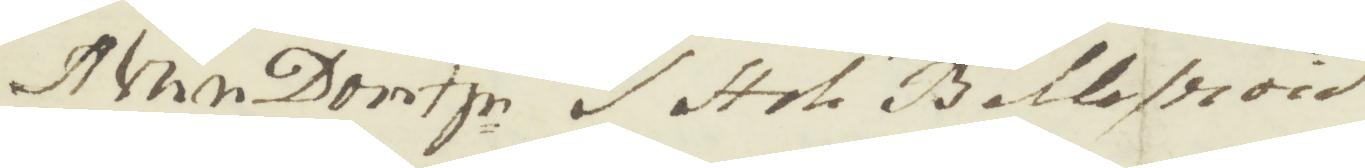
A Van Dort j=r I Stok Bellefroid
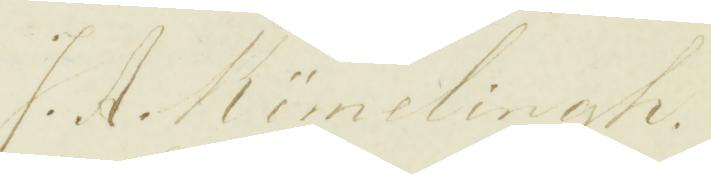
J. A. Römelingh.
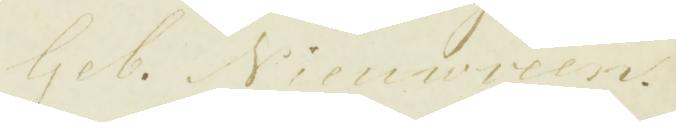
Geb. Nieuwveen.
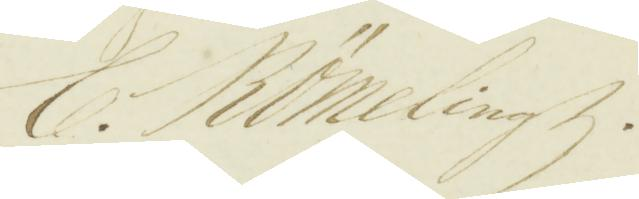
C: Römelingh
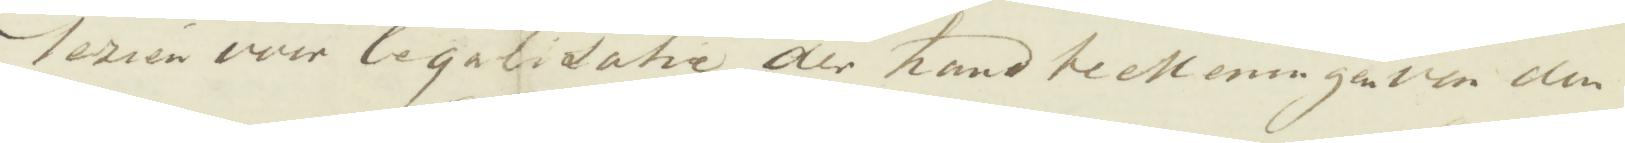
Gezien voor legalisatie der handteekeningen van den
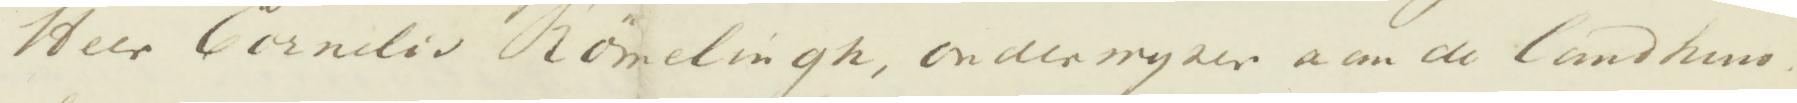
Heer Cornelis Römelingh, onderwijzer aan de landhuis
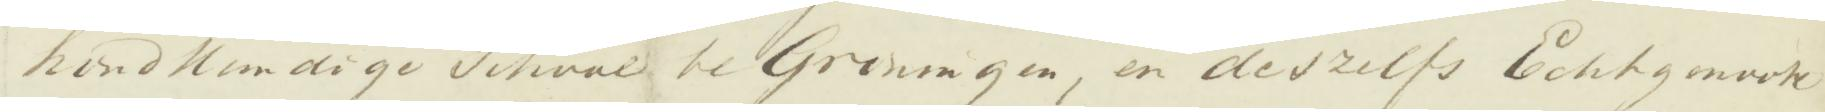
houdkundige school te Groningen en deszelfs Echtgenoote
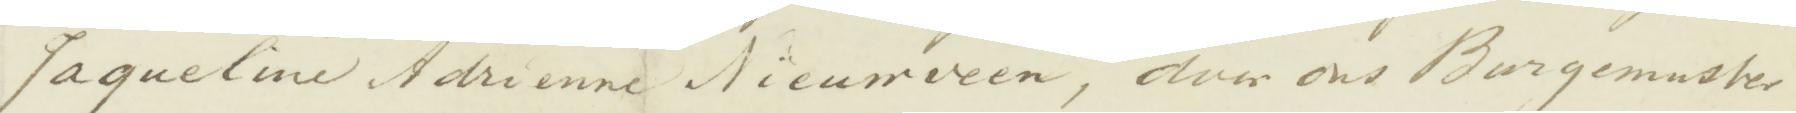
Jaqueline Adrienne Nieuwveen, door ons Burgemeester
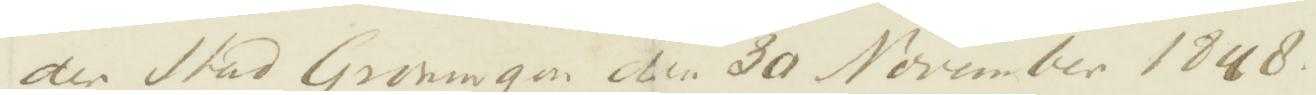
der Stad Groningen den 30 November 1848.
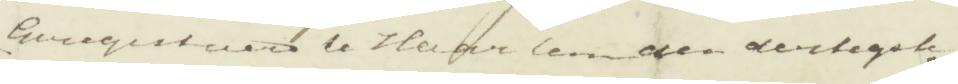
Geregistreerd te Haarlem den dertigste
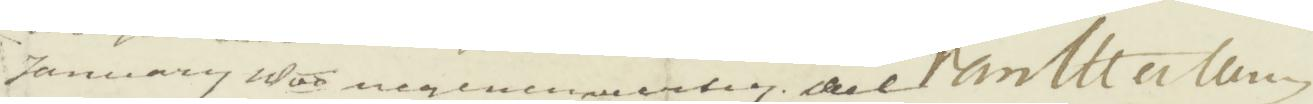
January 1800 negenenentig deel van Utterlum
